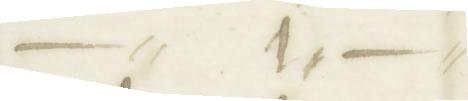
—„ 1„—„
